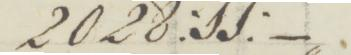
2028:11: –
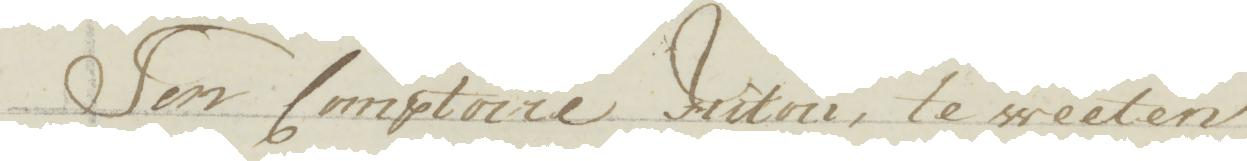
Ten Comptoire Mitou, te weeten
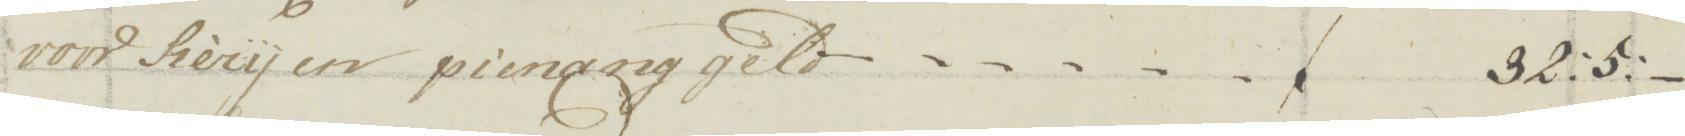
voor sierij en pienang geld — – – – – – ƒ 32:5:—
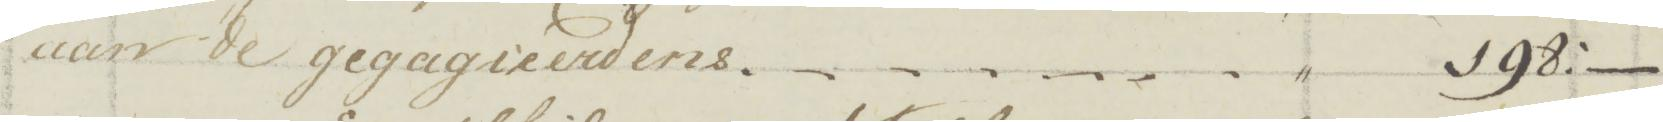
aan de gegagieerdens . – – – – – - „ 198:—
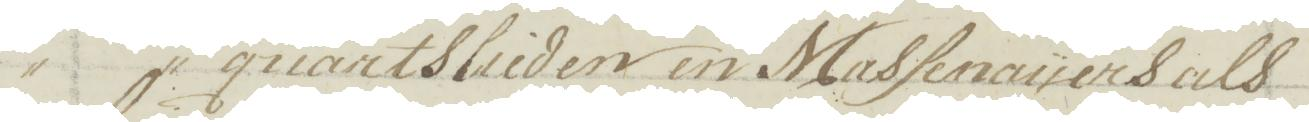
„ „ quartslieden en Massenaijers als
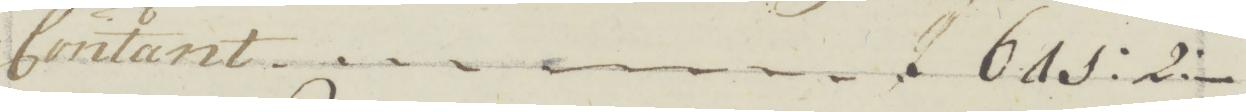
Contant - – – – – – – – – ƒ 641: 2:—
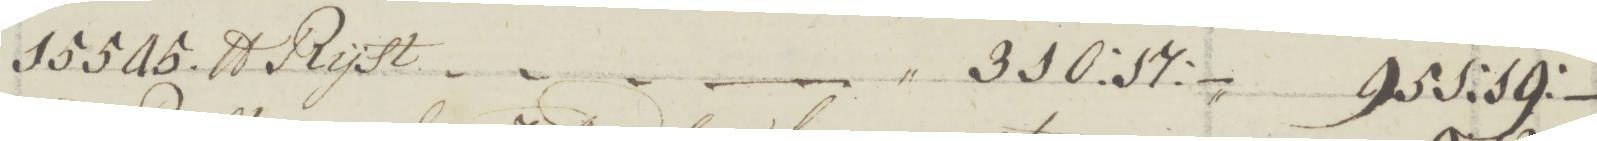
15545. lb Rijst – – – – – . „ 310:17:–„ 955:19:—
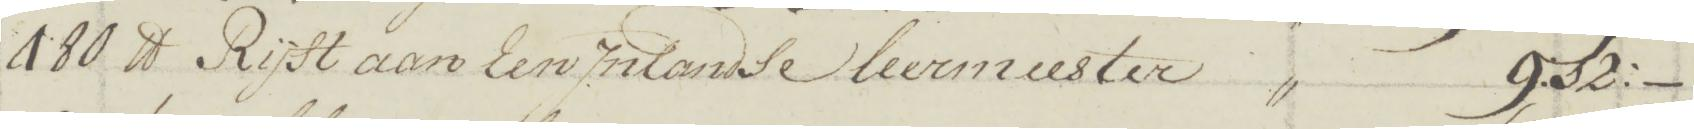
480 lb Rijst aan Een Jnlandse leermeester „ 9:12:—
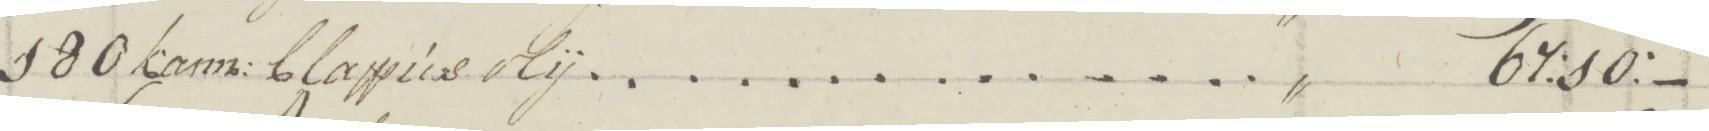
180 kann: Clappus olij . . . . . . . . - . - - . . „ 67:10:—
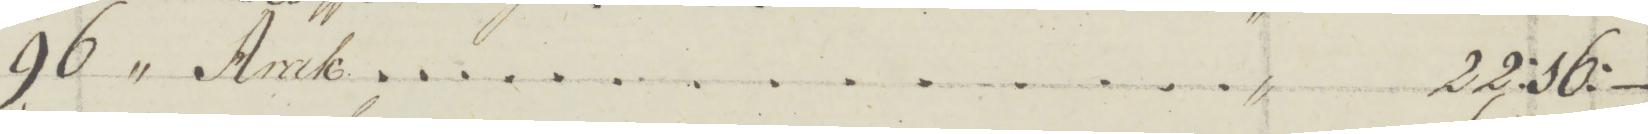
96 „ Arak . . . . . . . . . . . . . . . „ 22:16:—
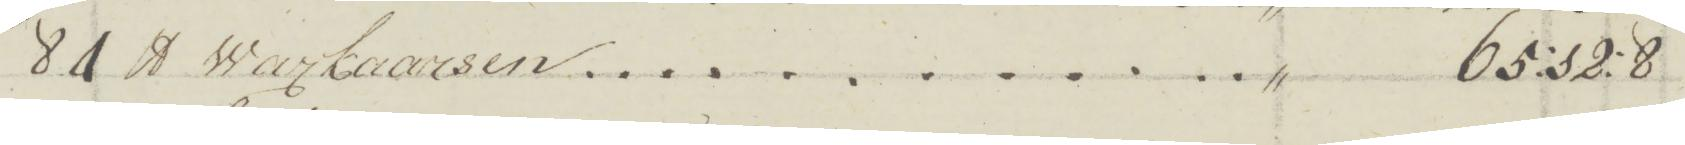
84 lb waxkaarsen . . . . . . . . . . . . „ 65:12:8
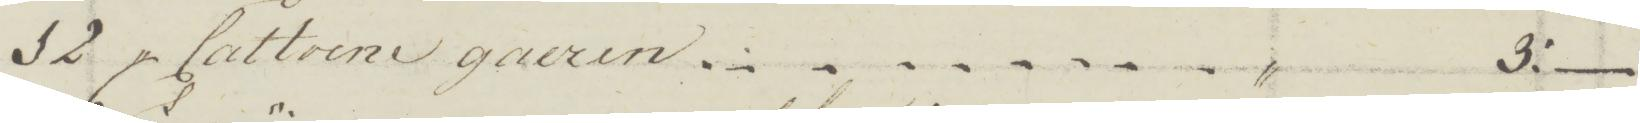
12 „ Cattoene gaeren . - - - - - - - . „ 3:—
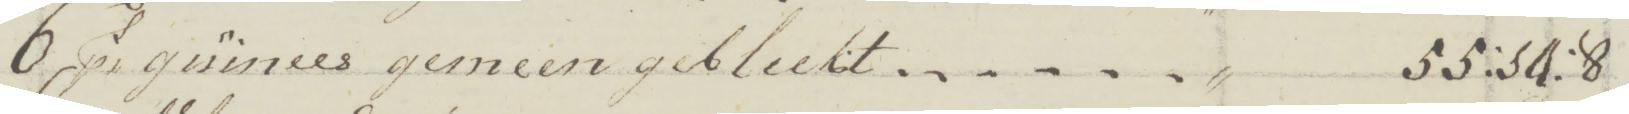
6 p„s guinees gemeen gebleekt . - - - - - „ 55:14:8.
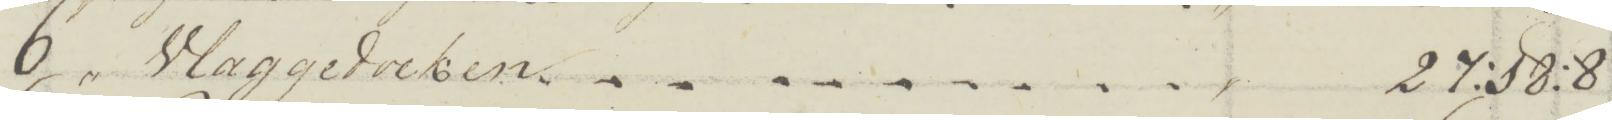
6 „ vlaggedoeken - – – - – – – - . . „ 27:18:8
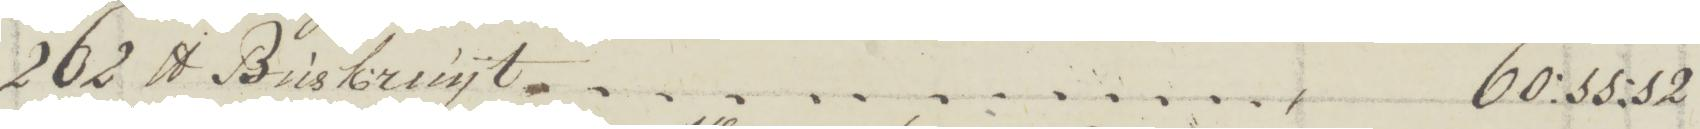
262 lb Buskruijt – – - - - - - - - - - - . „ 60:11:12
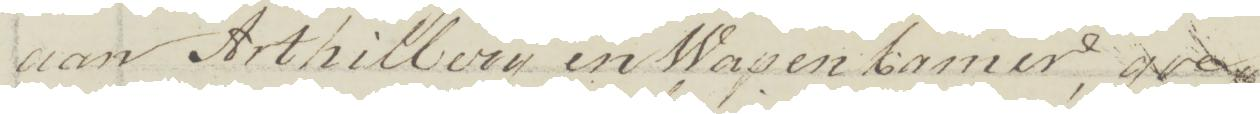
aan Arthillerij en wapenkamers goe
